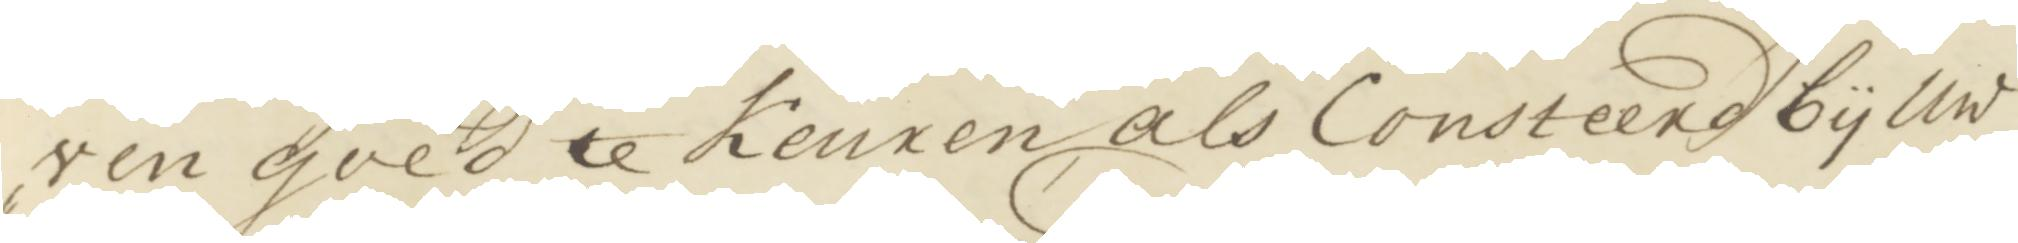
„ven goed te Keuren als Consteerd bij uw
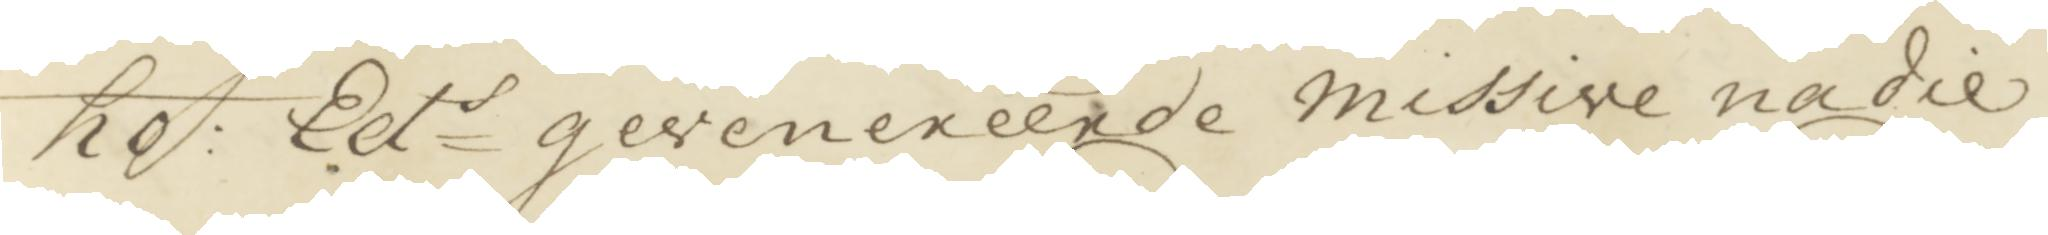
ho: Ed=s gevenereerde missive na die
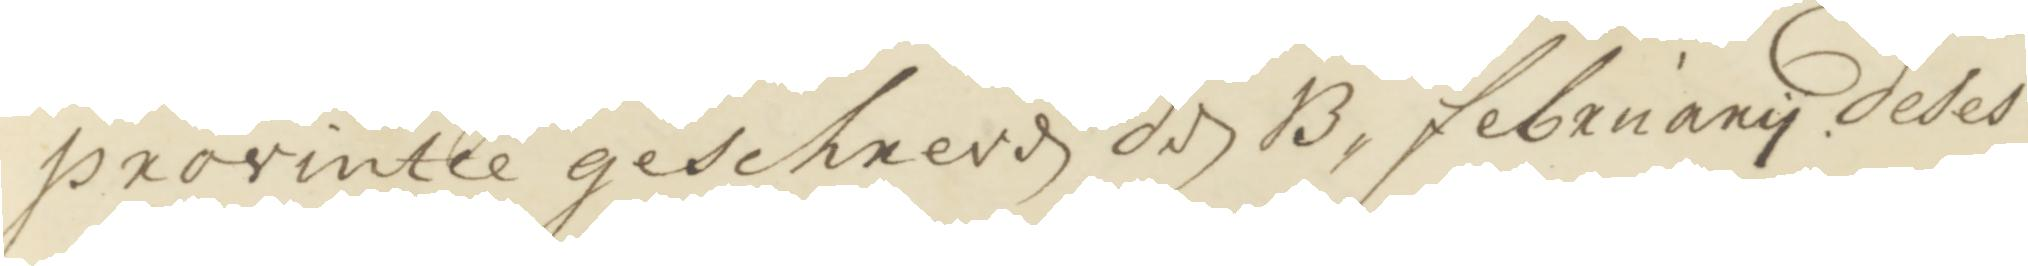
provintie geschreven den 13„e februarij deses
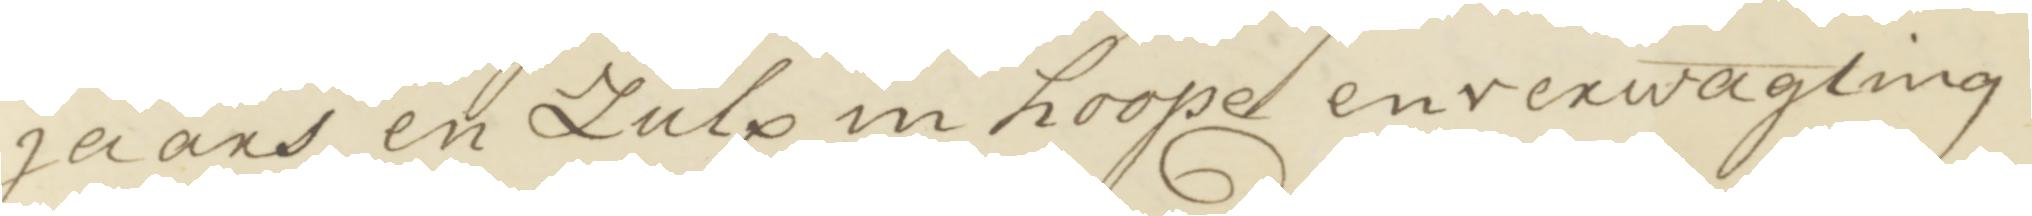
jaars, en Zulx in hoope en verwagting
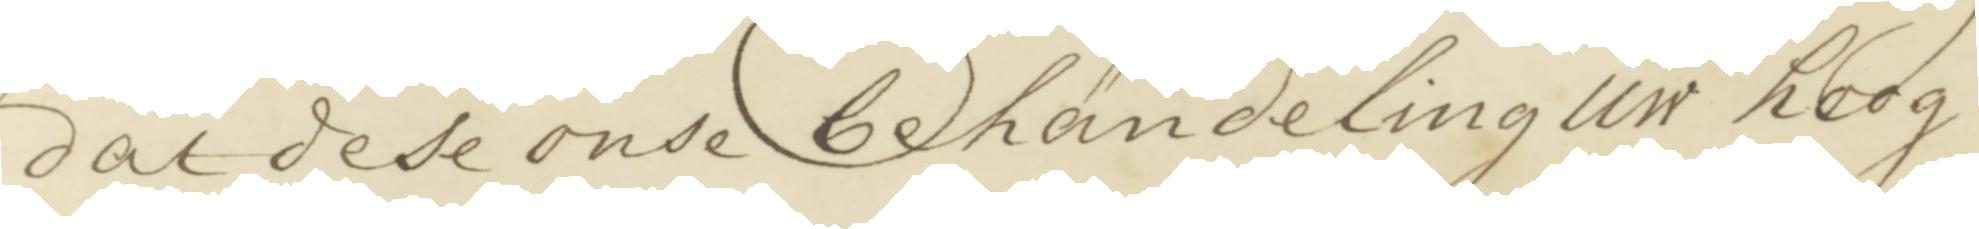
dat dese onse behandeling uw hoog
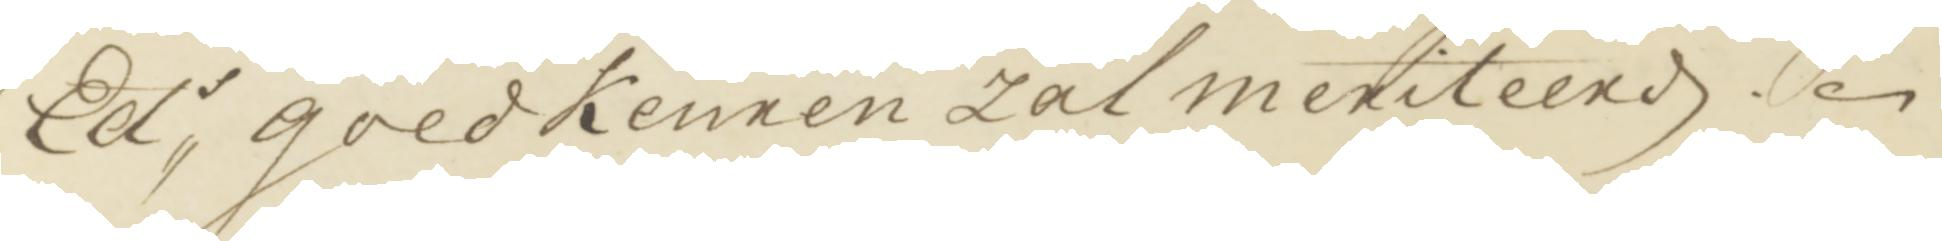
Ed„s goedkeuren zal meriteeren.-
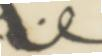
U
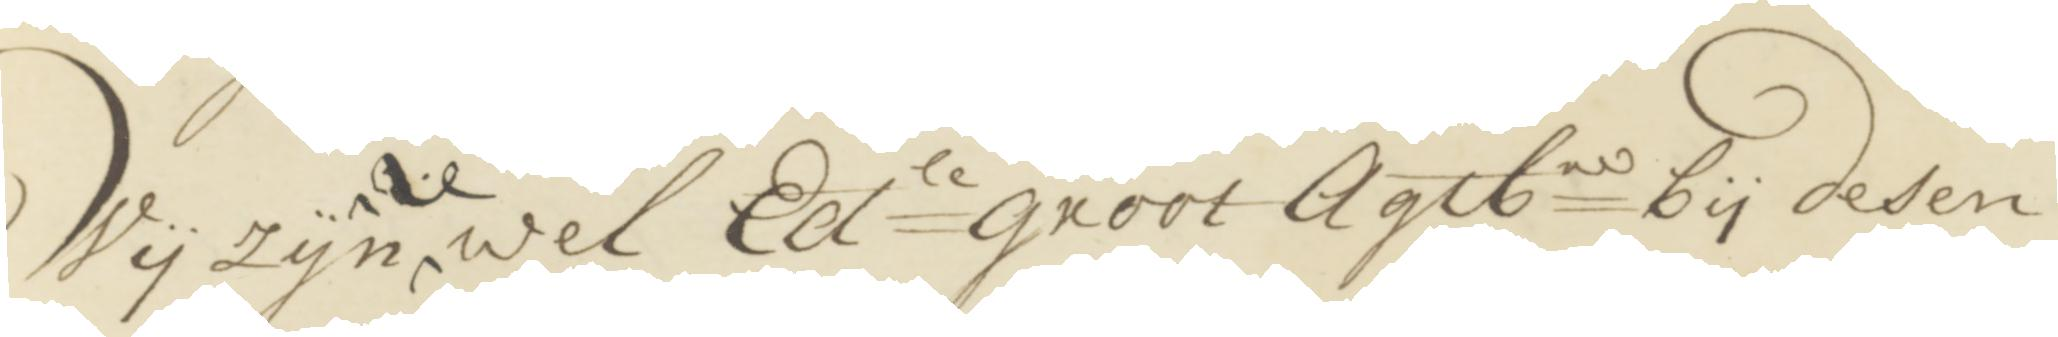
Wij zijn ^ wel Ed=le groot Agtb=re bij desen
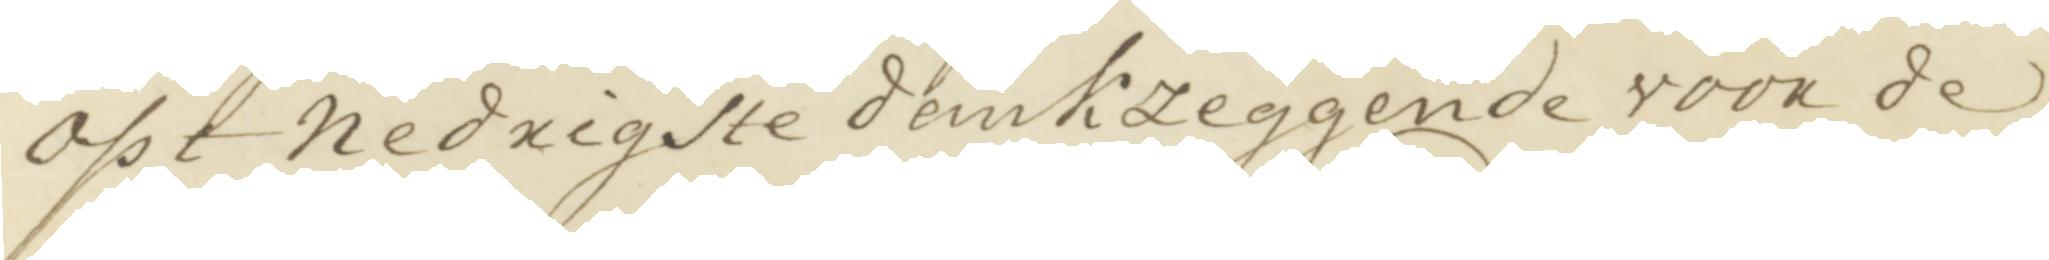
op ’t nedrigste dank zeggende voor de
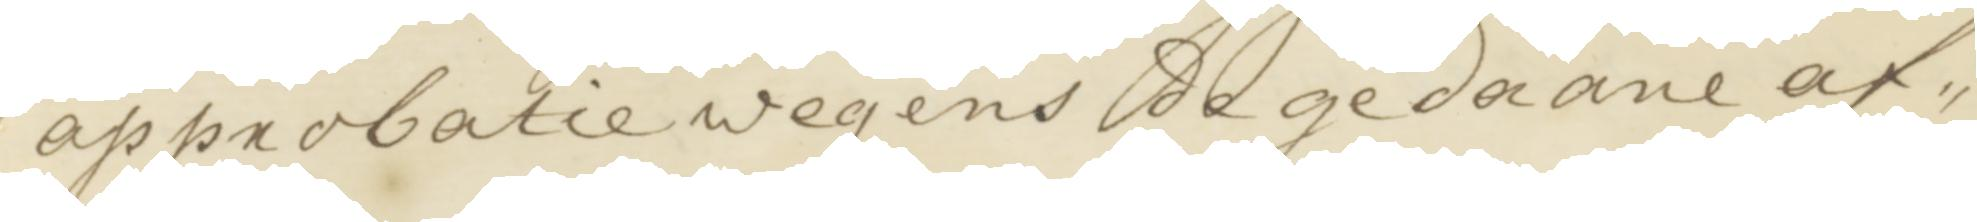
approbatie wegens de gedaane af„
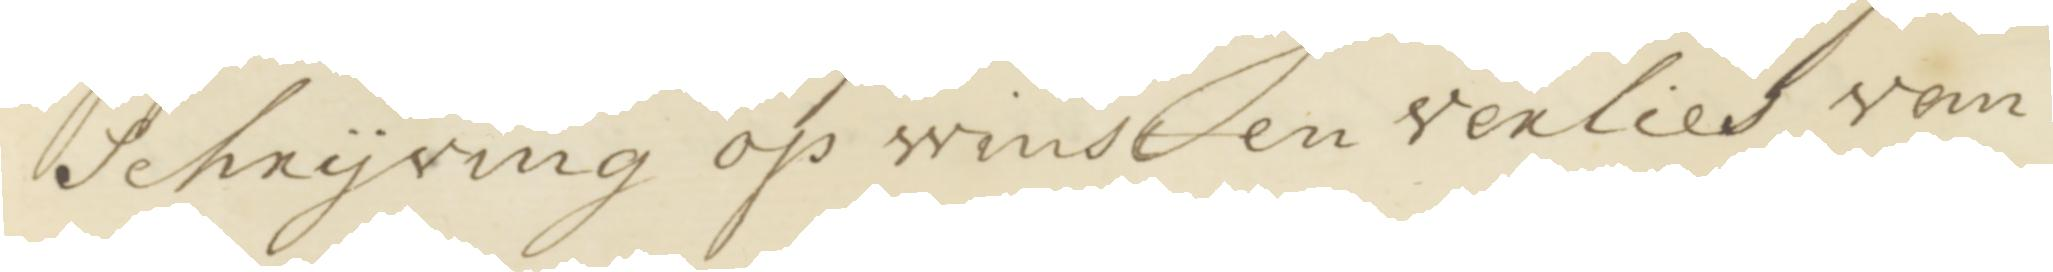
Schrijving op winst en verlies van
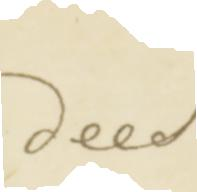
dees
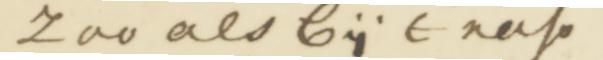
zoo als bij t rap
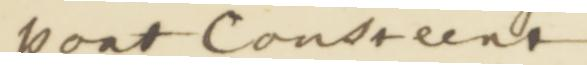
port Consteert
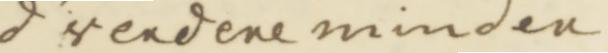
d’ verdere minder
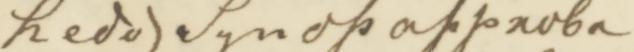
heeden Syn op approba
